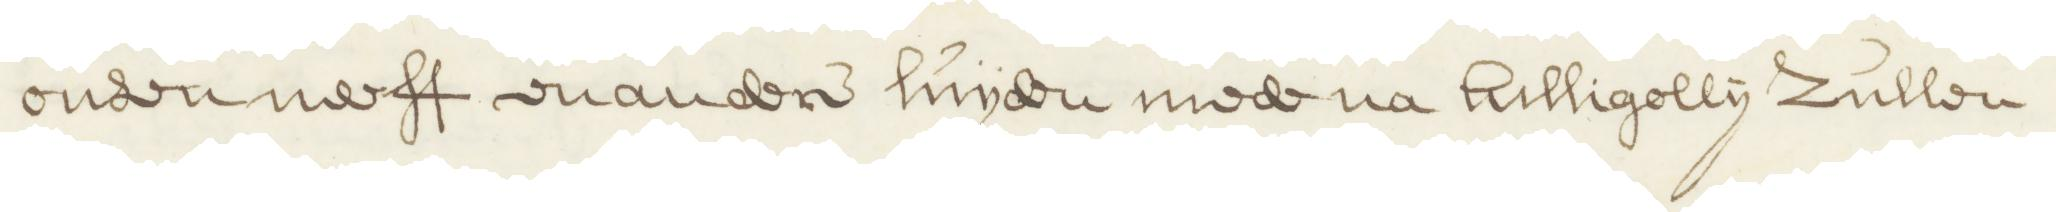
onsen neeff en andere luijden mede na killigollij zullen
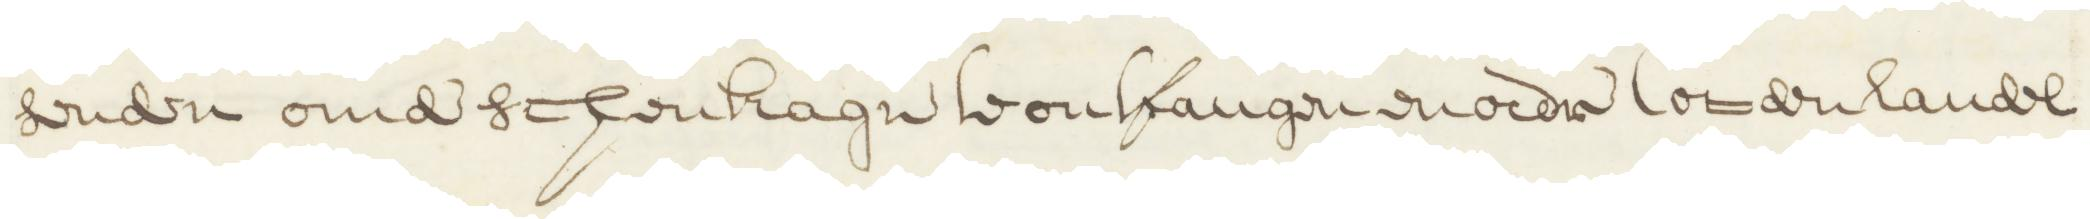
senden om de schenkagie te ontfangen en ordre tot den handel
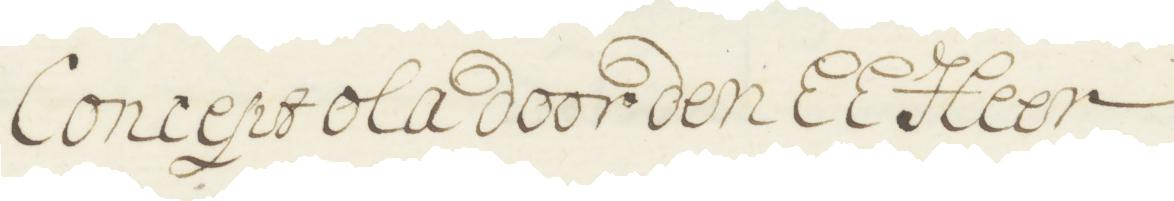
Concept ola door den E E Heer
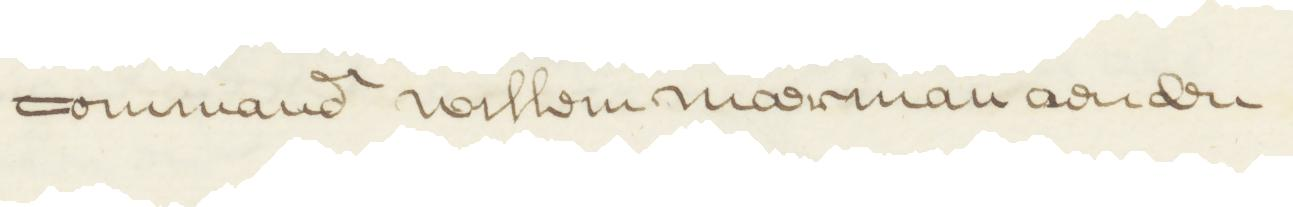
commandr willem moerman aen den
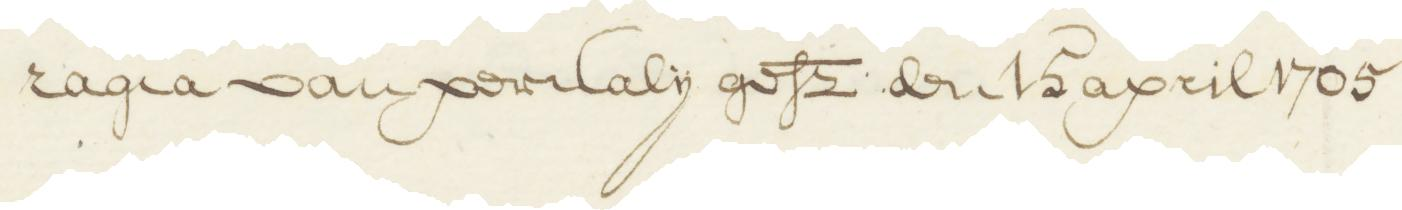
ragia van peritalij gesz: den 15 april 1705
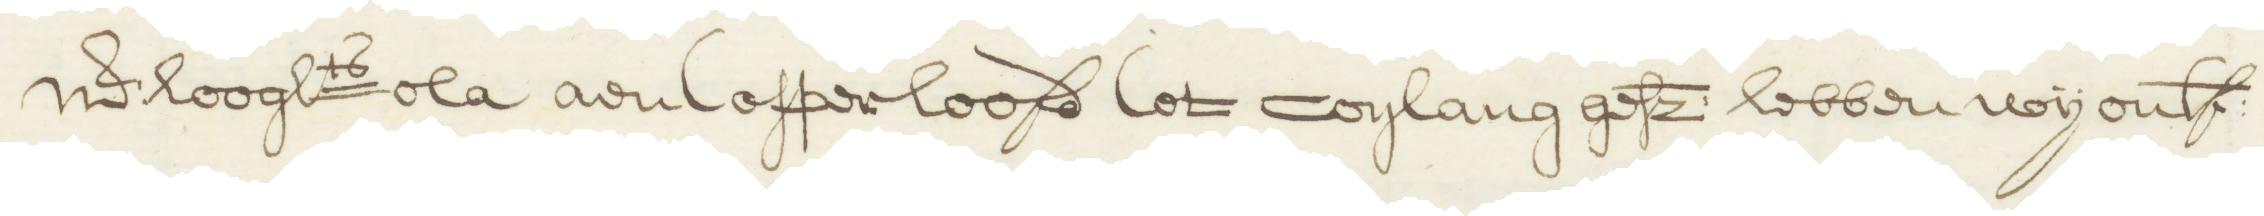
uE hoogh=ts ola aen t opperhoofd tot coylang gesz: hebben wij ontf:
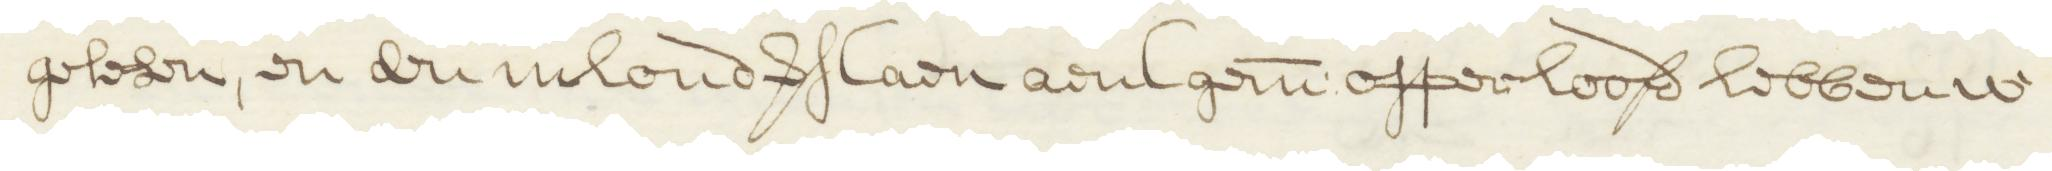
gelesen, en den inhoud verstaen aen t gem: opperhoofd hebben w'
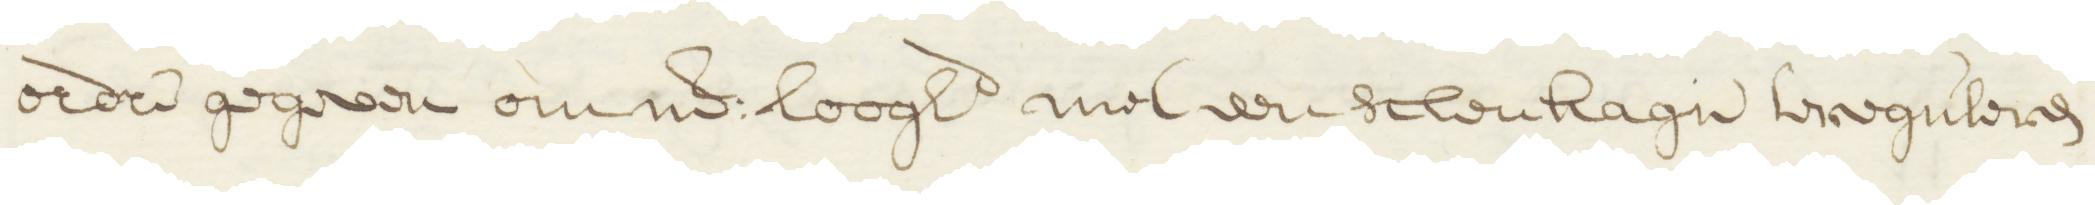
ordre gegeven om uE: hooghd met een schenkagie te reguleren
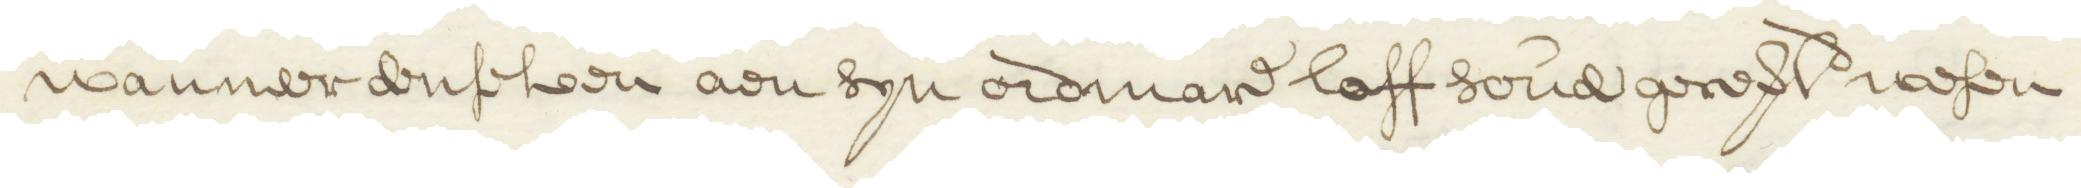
wanneer denselven aen syn ordinare loff soude gereverld wesen
